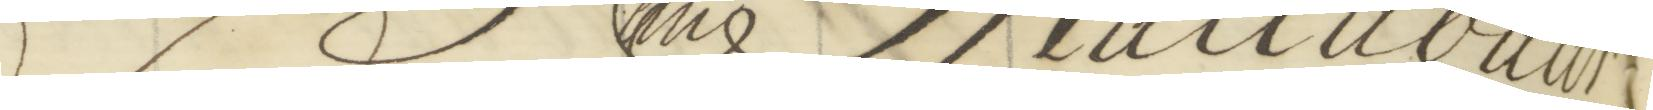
Van Mallabaar
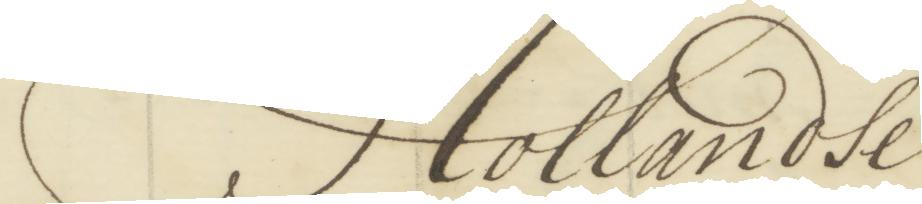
Hollandse
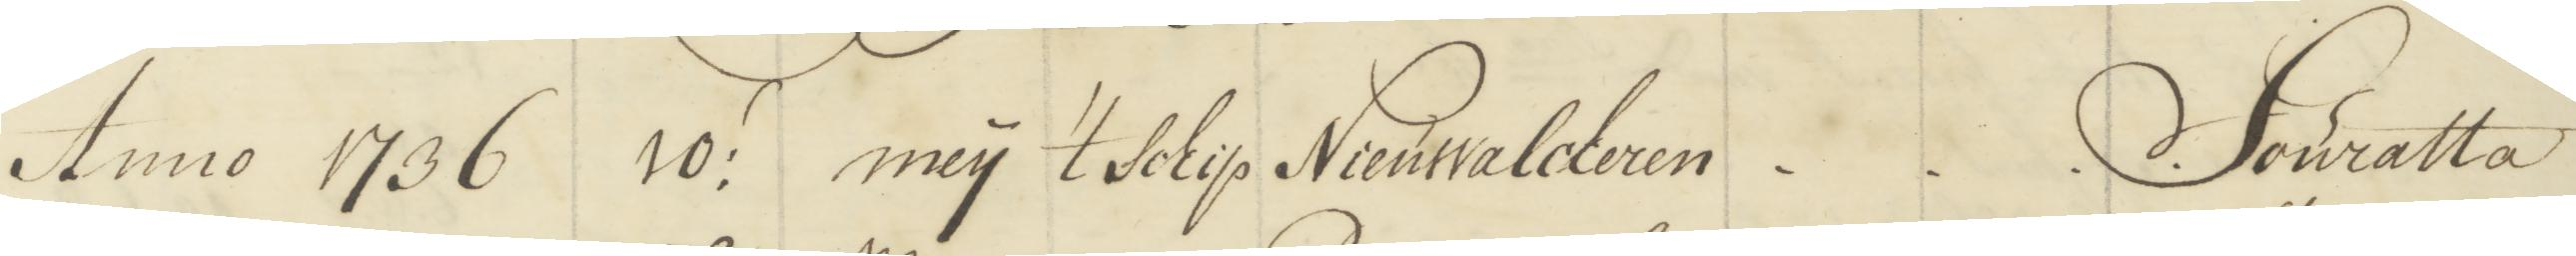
Anno 1736 10:' meij ’t schip Nieuwalcheren - - . . Souratta
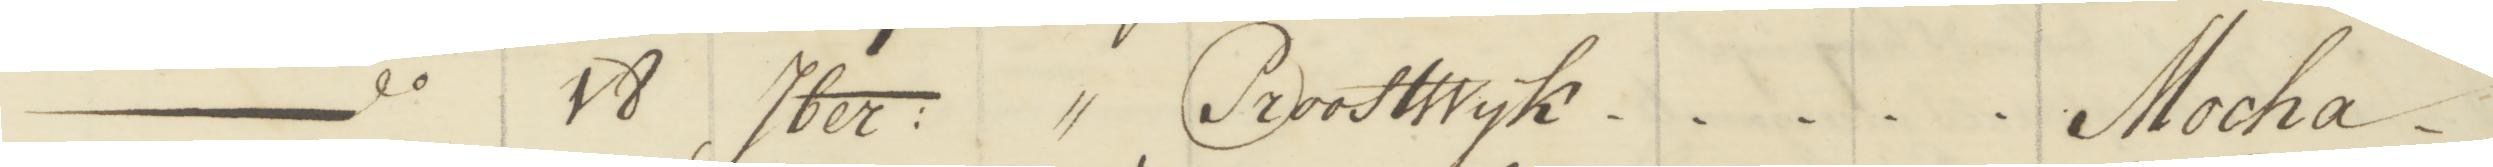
_o 18 Jber: „ Proostwijk - - - - - Mocha -
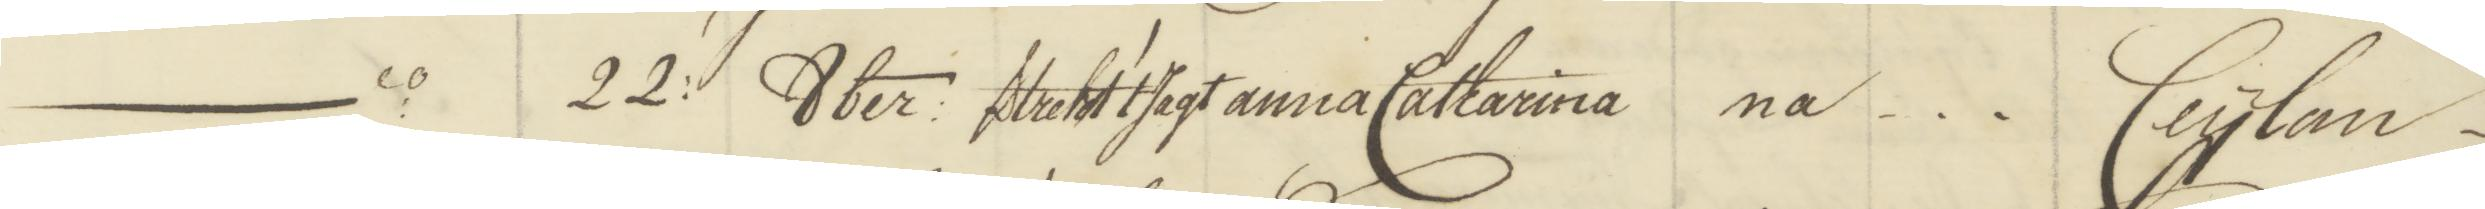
_:o 22:' 8ber: vertrekt 't Jagt anna Catharina na . . - Ceijlon -
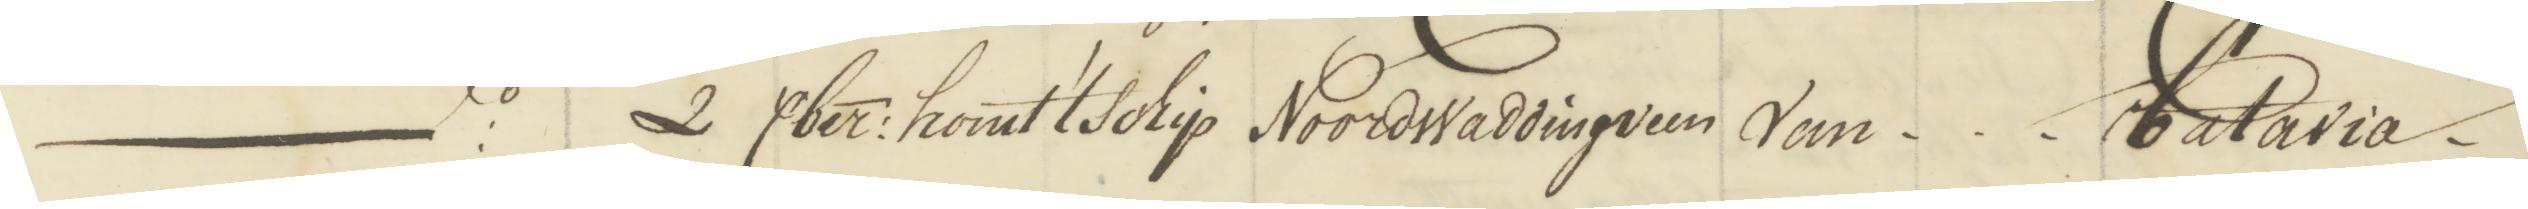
_:o 2 xber: komt 't schip Noordwadding van - - - batavia -
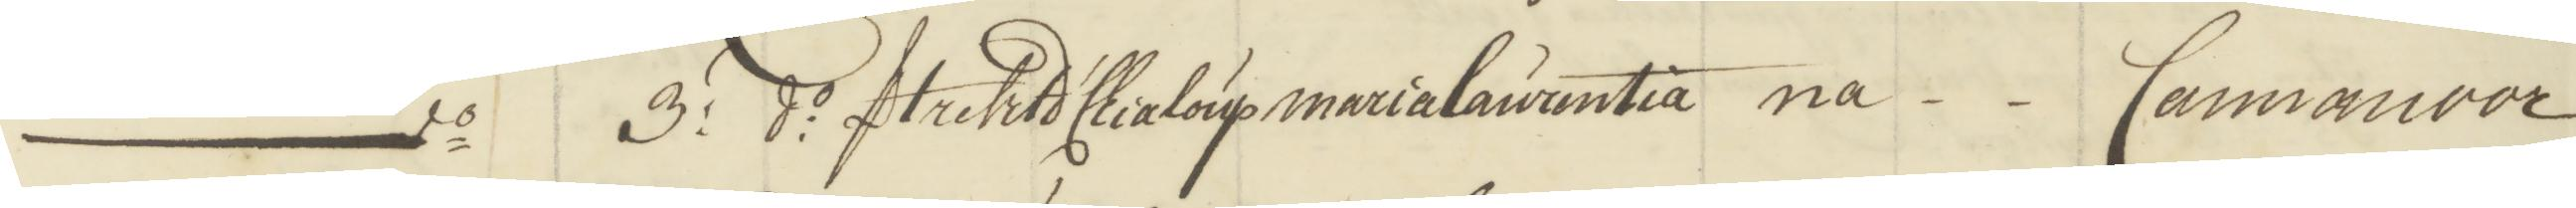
_=o 3:' d:o vertrekt d' Chialoup marialaurentia na - - Cannanoor
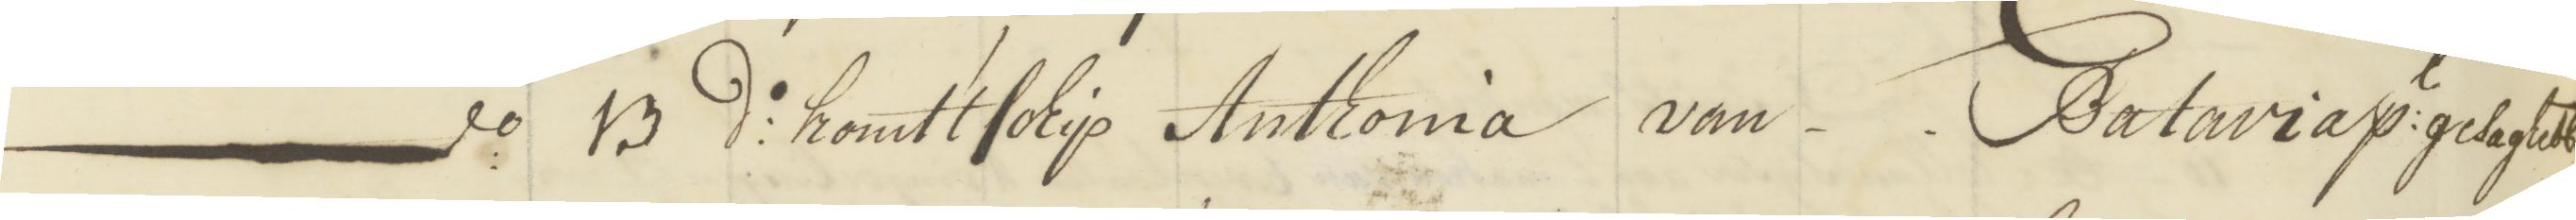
_:o 13 d:o komt 't schip Anthonia van - - Batavia p:l gesaghebb:
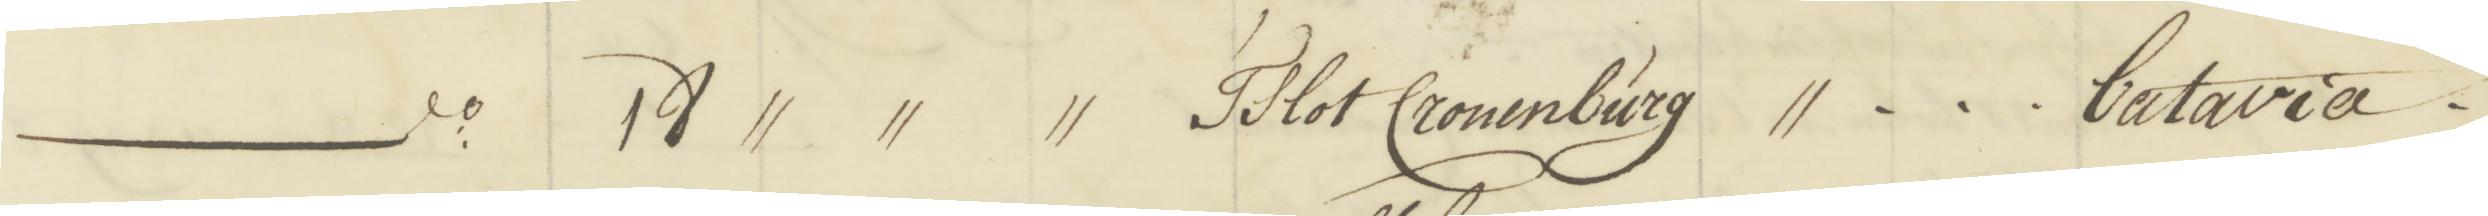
_:o 18 „ „ „ 'TSlot Cronenburg „ - . . batavia -
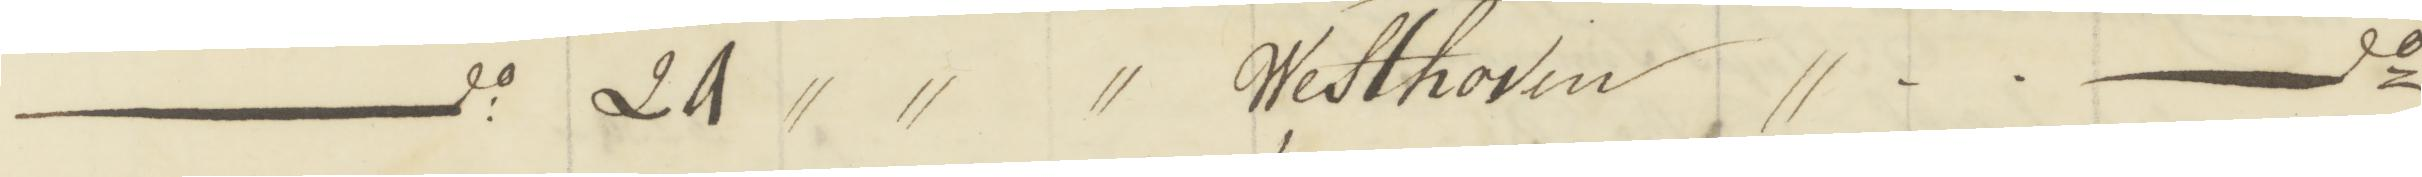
_:o 24 „ „ „ Westhoven „- . _=o
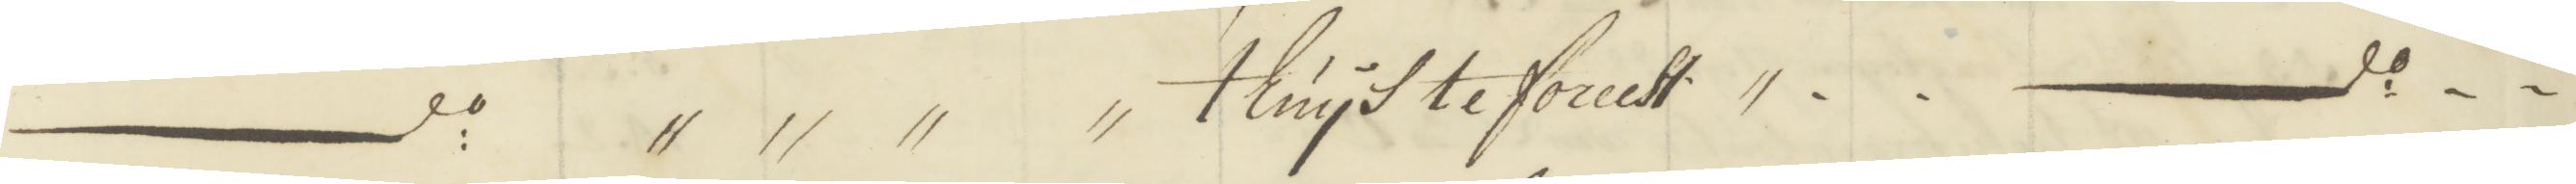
_:o „ „ „ „ 'thuijs te foreest „ . . _:o - -
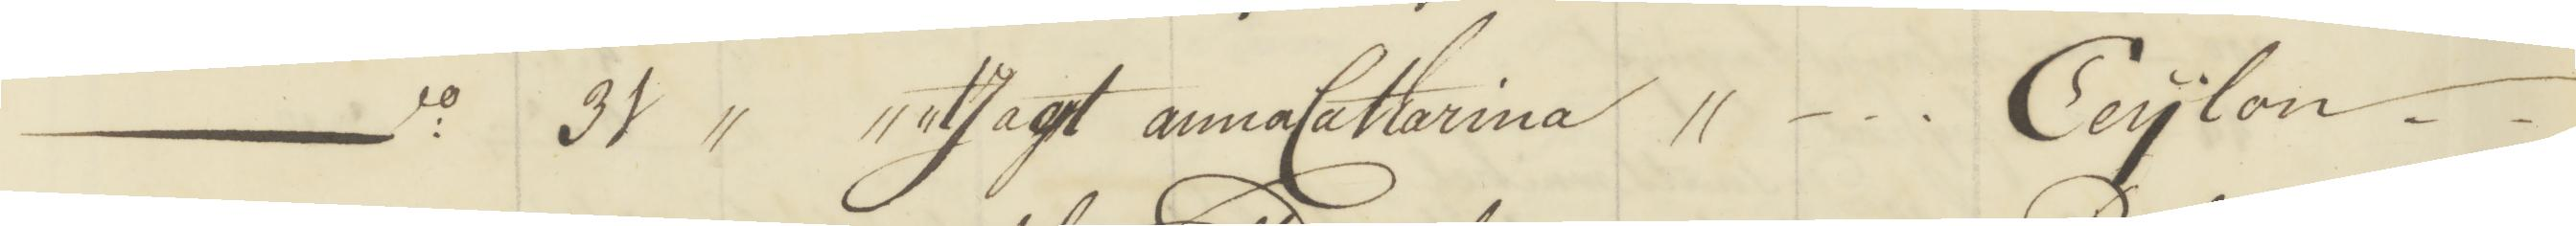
_:o 31 „ „ „tJagt annaCatharina „ - - . Ceijlon - -
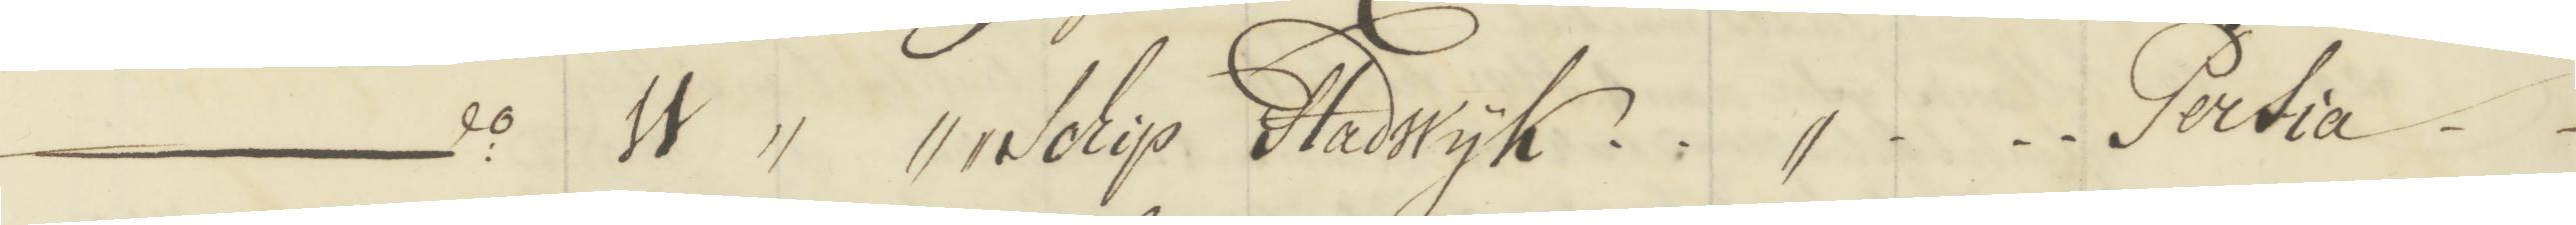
_:o 11 „ „ „schip stadwijk . . „ - - - Persia - -
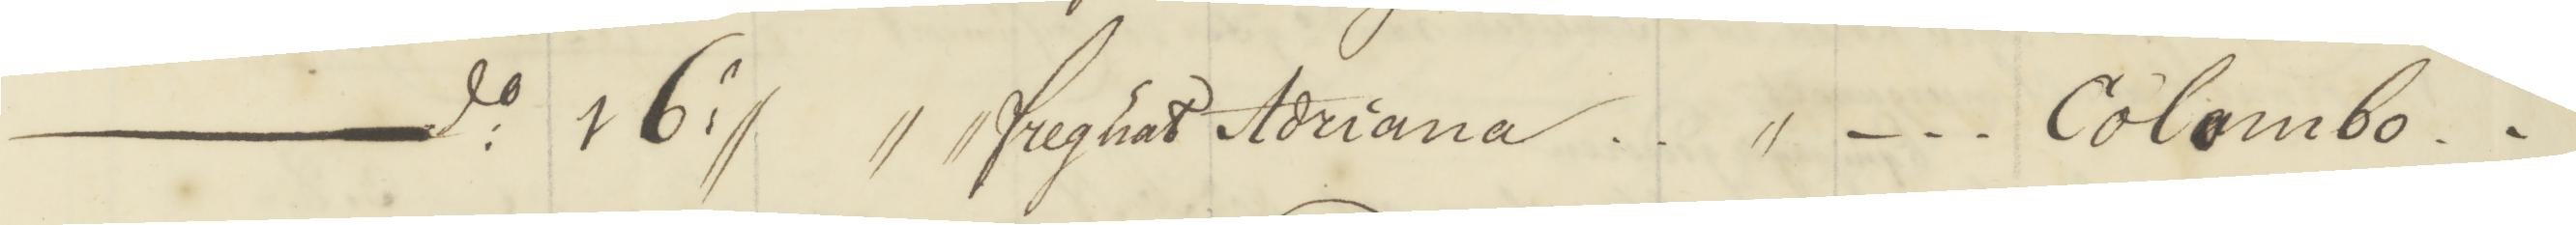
_:o 16:'„ „ „ freguat Adriana . . „ - - - Colombo . -
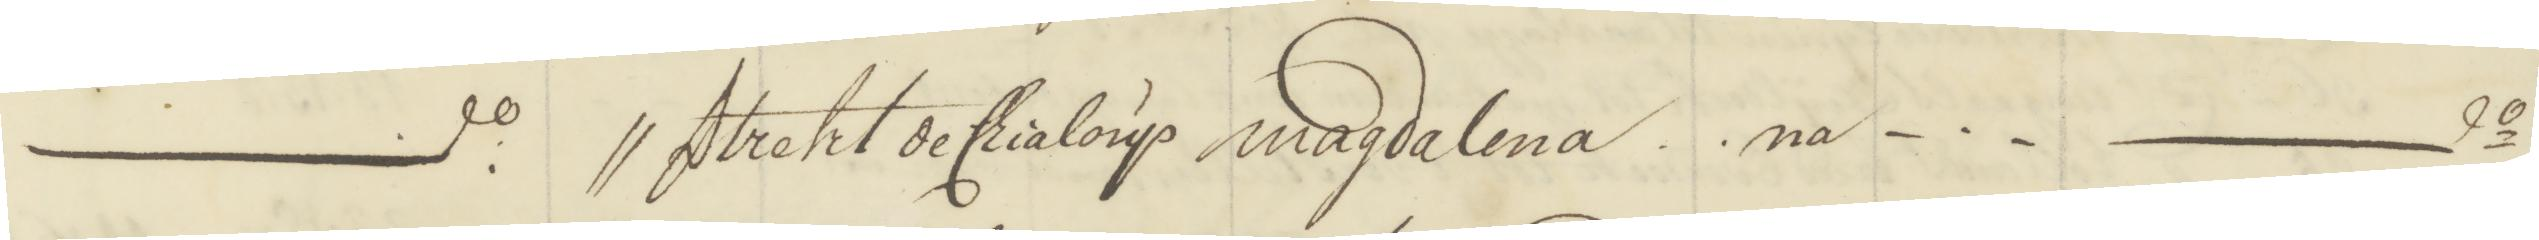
_:o „ vertrekt de Chialoup magdalena . . na - . - _=o
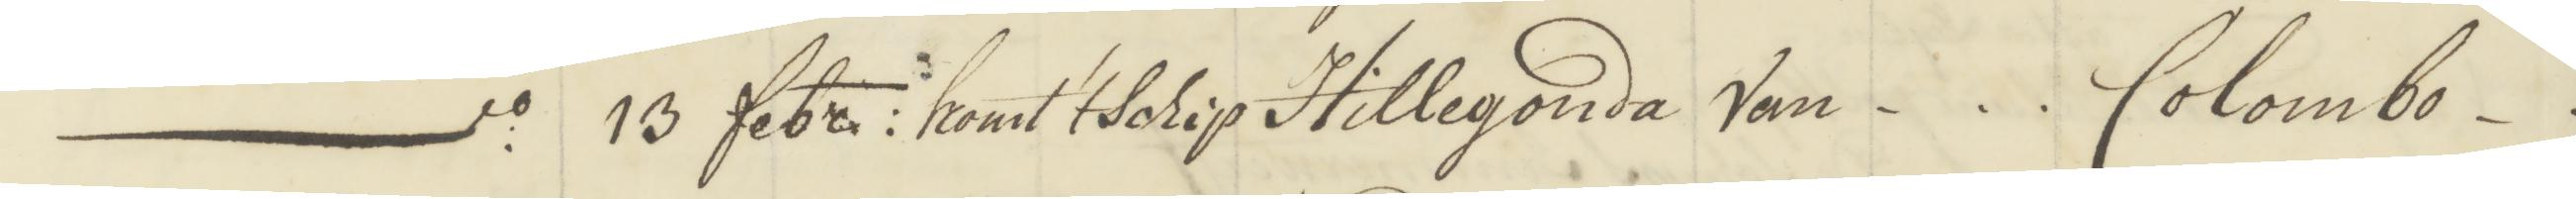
_:o 13 febr: komt 'tschip Hillegonda van - . . Colombo -
